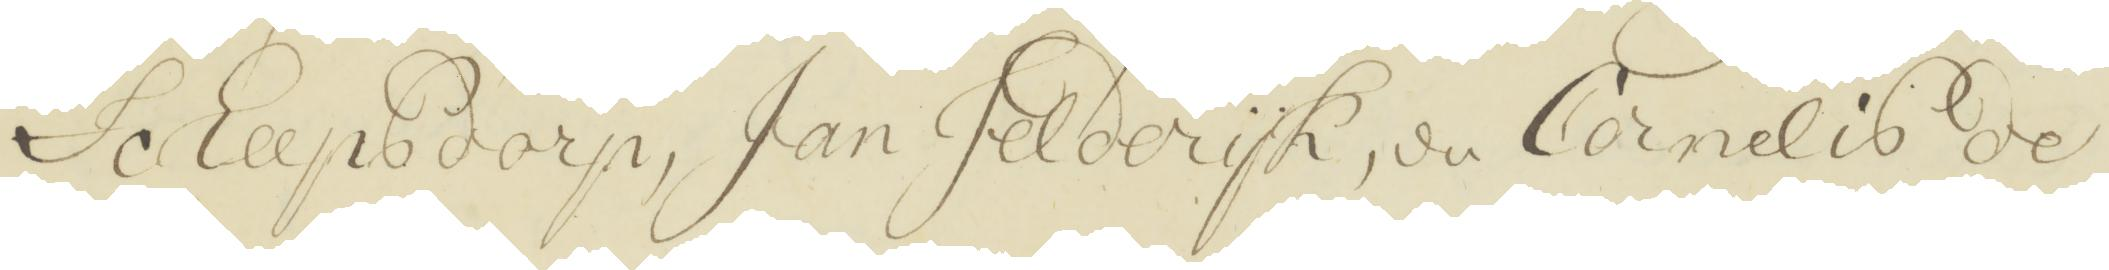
Scheepsdorp, Jan Selderijk, en Cornelis de
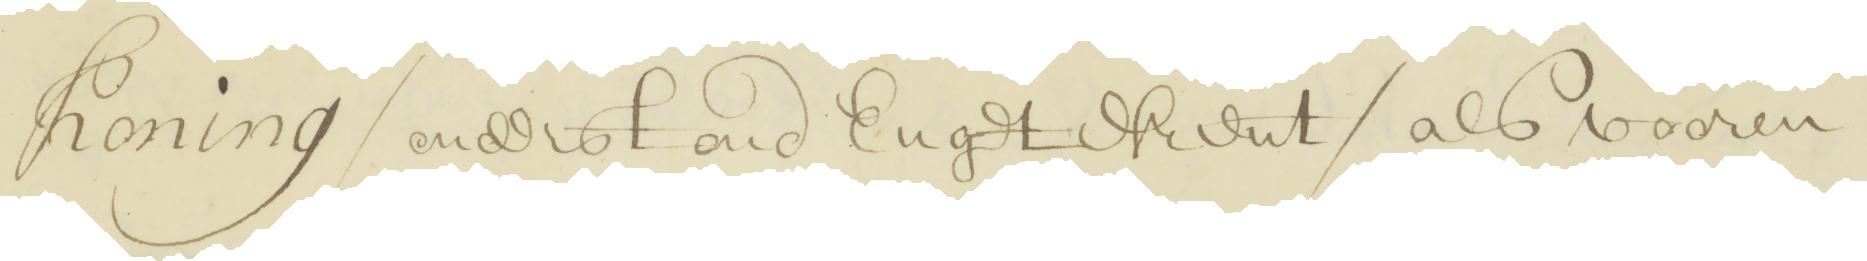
Koning /onderstond En getekent/ als vooren
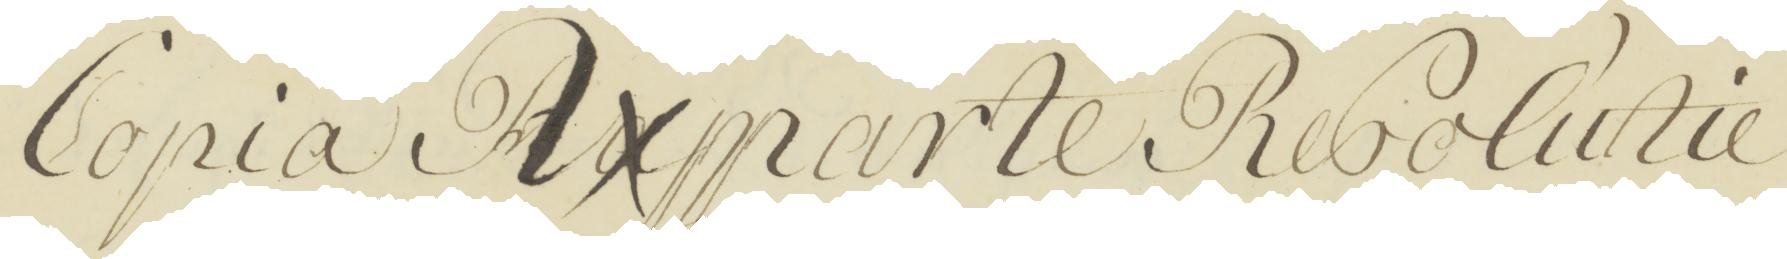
Copia Aapparte Resolutie
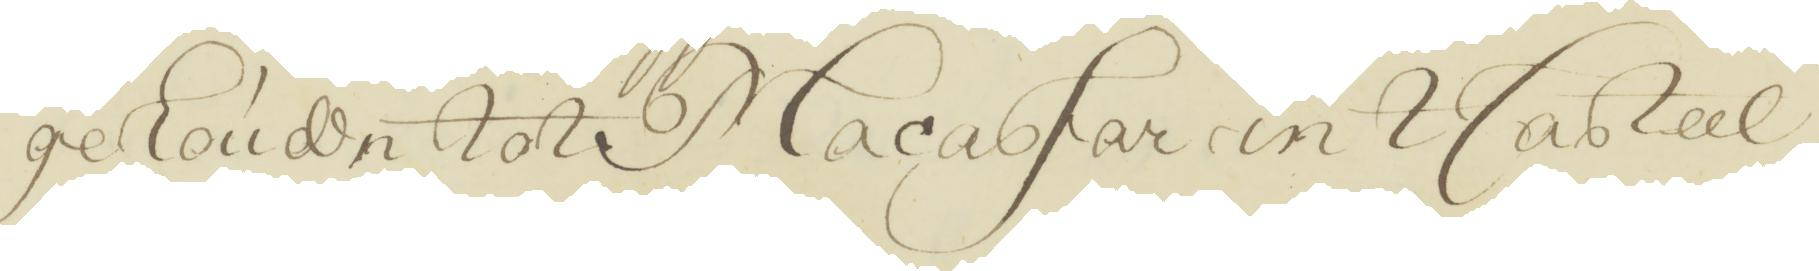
gehouden tot Macassar in 't Casteel
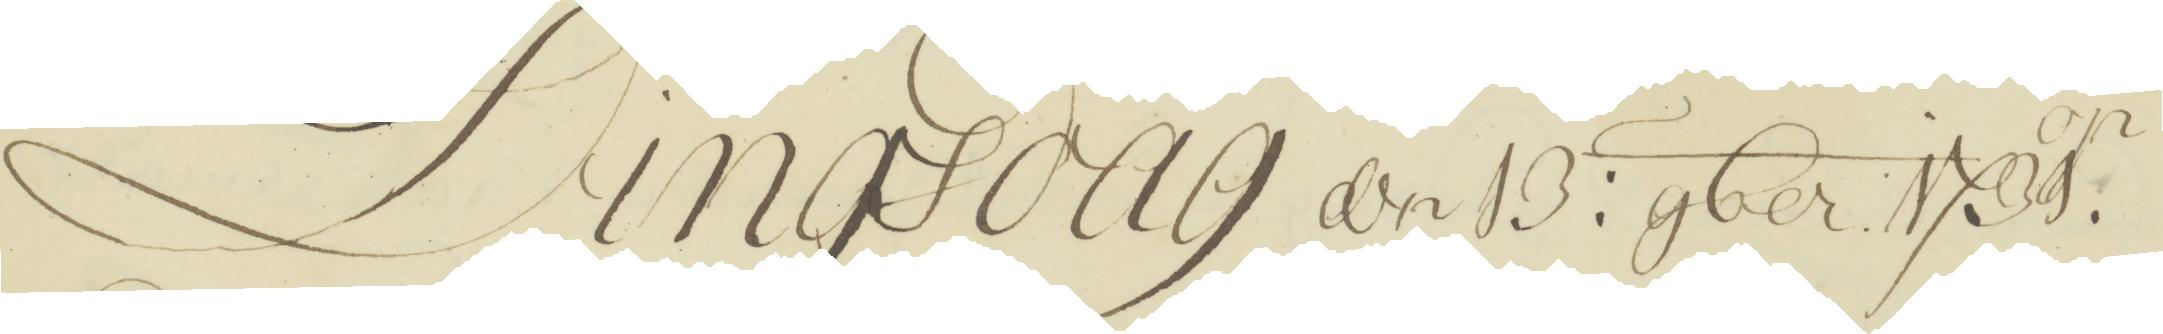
Dingsdag den 13:' 9ber: 1731.
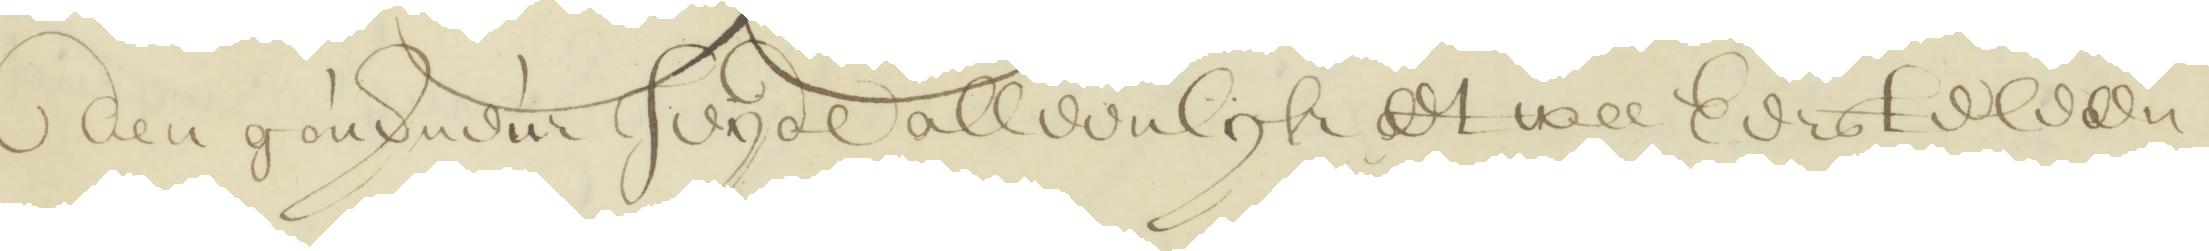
den gouverneur seijde alleenlijk de twee Eersteleden
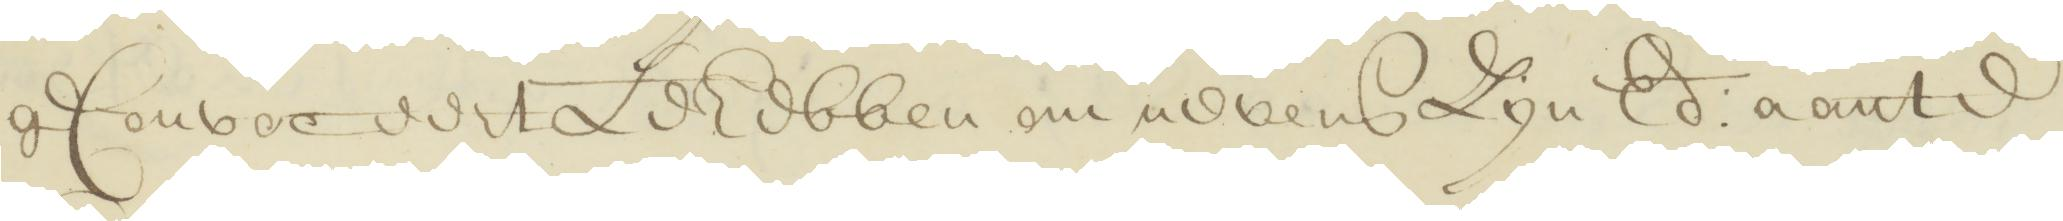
geconvoceert te hebben om nevens zijn Ed: aante
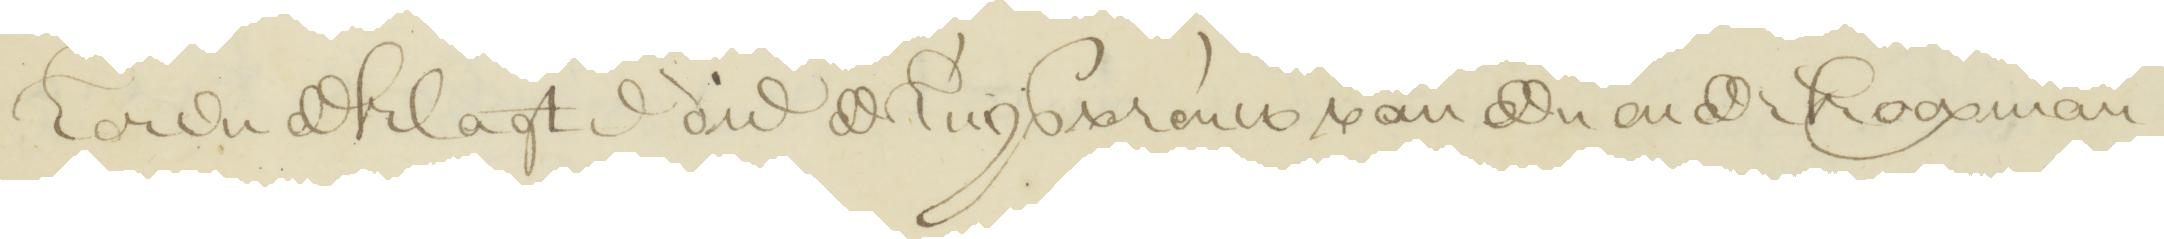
horen de klagte die de huijsvrouw van den onder koopman
